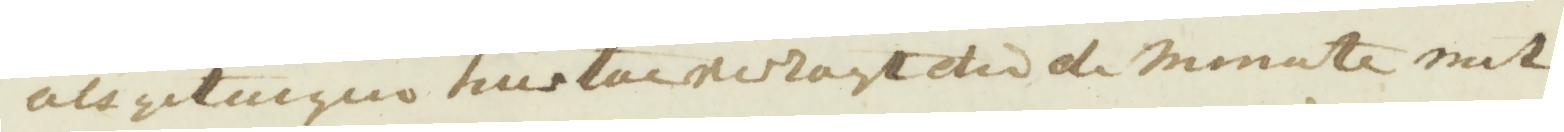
als getuigen hier toe verzogt die de minute met
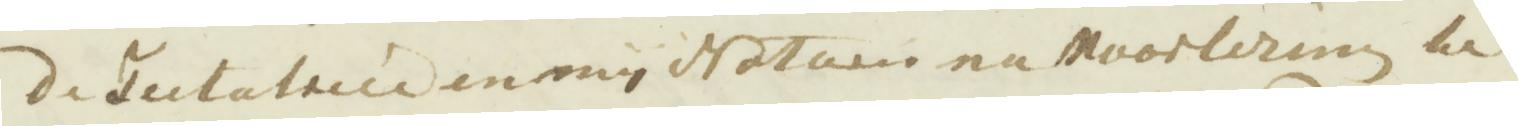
de Testatrice en mij Notaris na voorlezing be
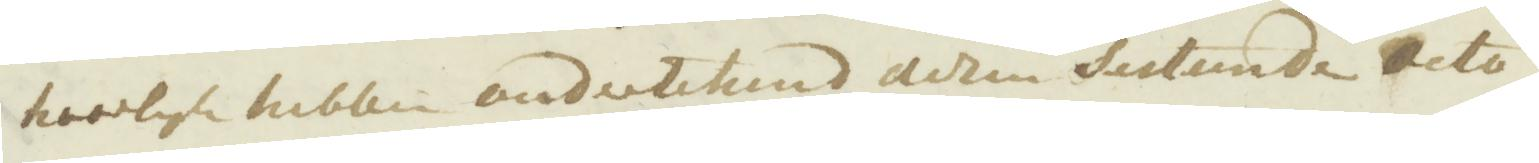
hoorlyk hebben ondertekend dezen sestiende dito
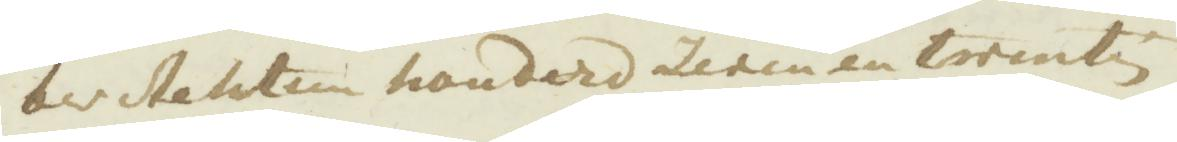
der Achtien honderd zeven en twintig
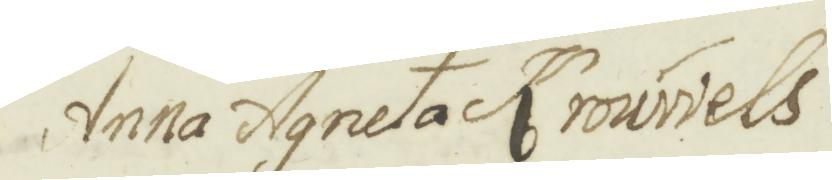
Anna Agneta Krouwels
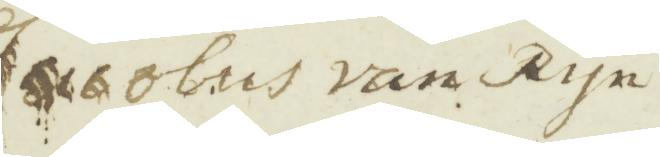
Jacobus van Ryn
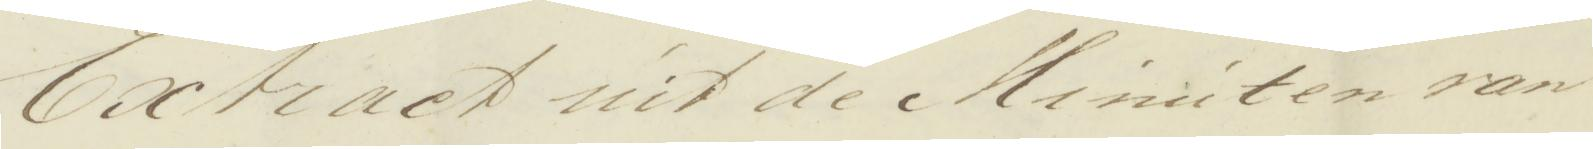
Extract uit de Minuten van
